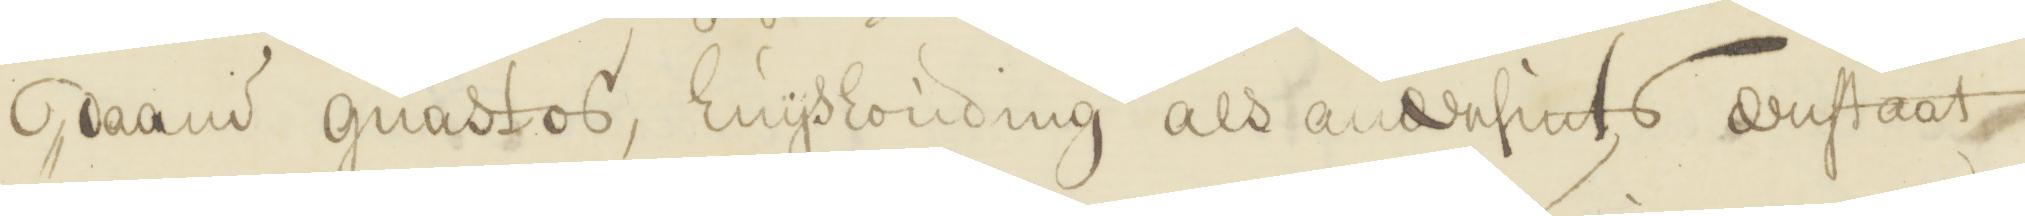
daane guastos, huijshouding als andersints denstaat
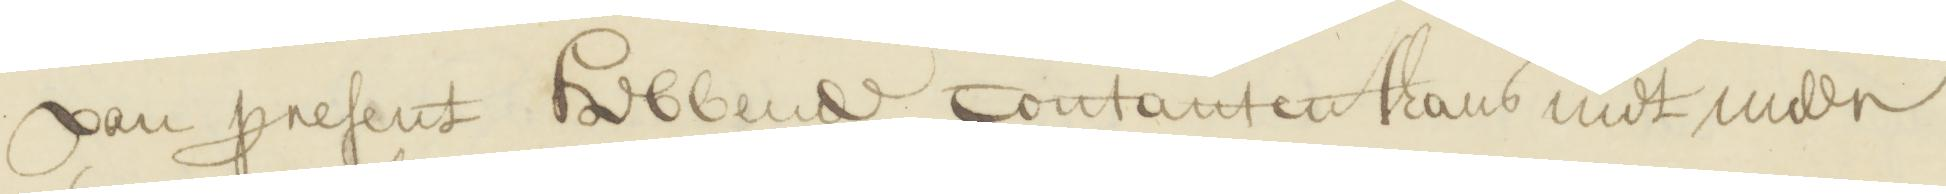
van present hebbende contanten thans niet meer
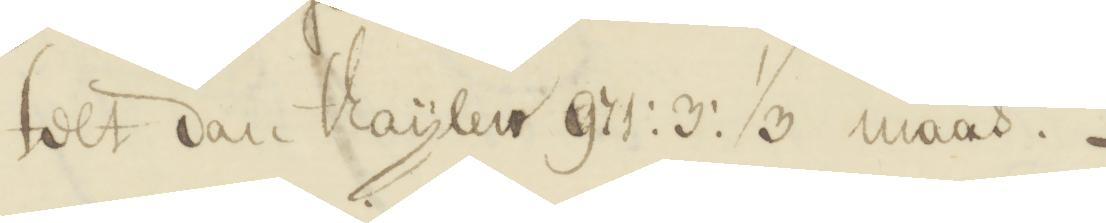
telt dan thaijlen 971:3:1/3 maas.
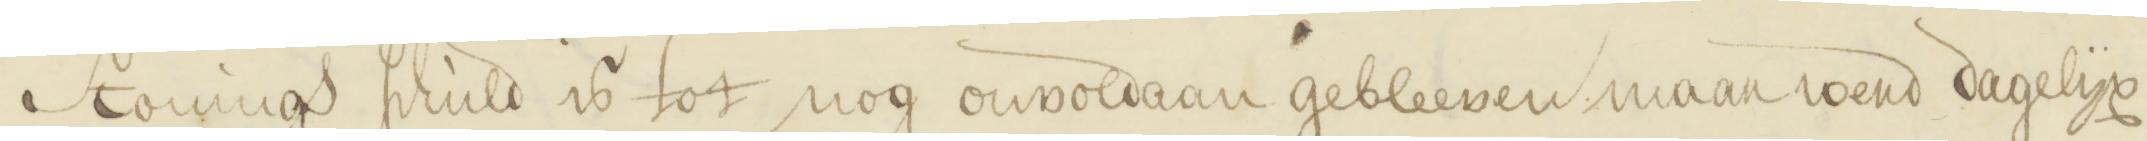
'sconings schuld is tot nog onvoldaan gebleeven maar werd dagelijx
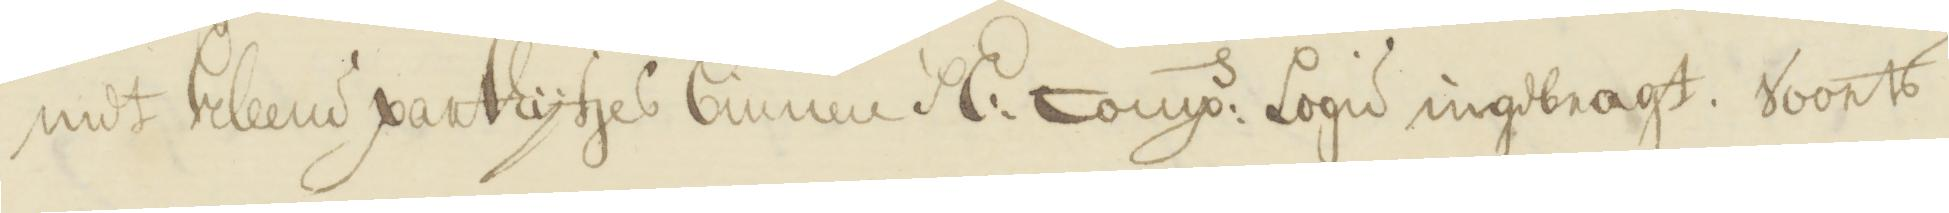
met kleene parthijtjes binnen 'sComp:s Logie ingebragt. voorts
